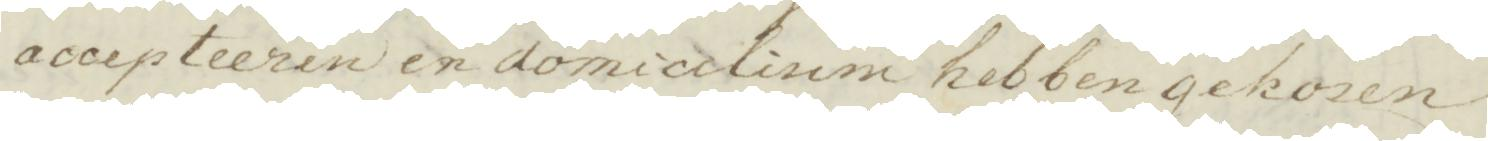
accepteeren en domicilium hebben gekozen
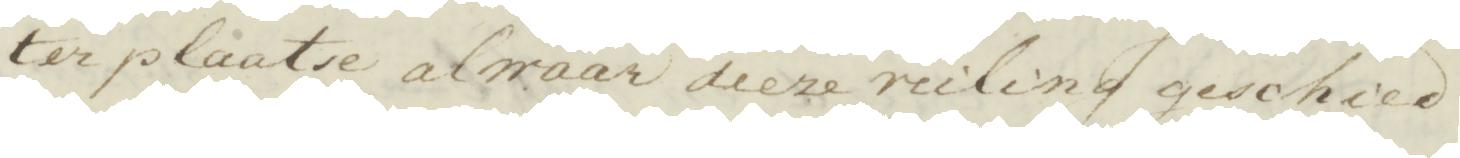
ter plaatse alwaar deeze veiling geschied
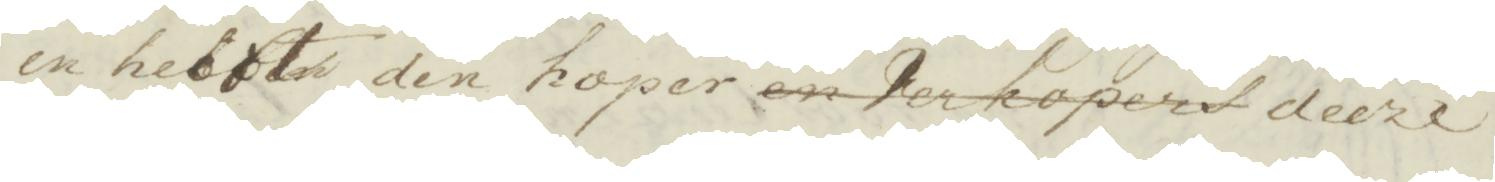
en heeft den koper en verkopers deeze
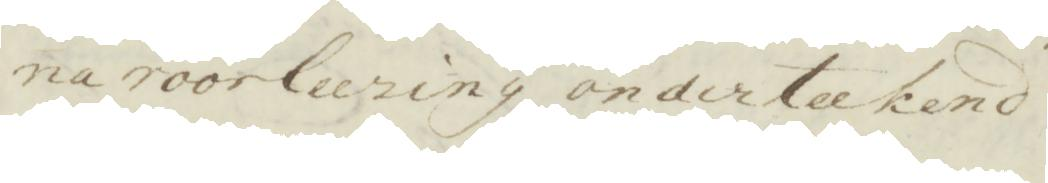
na voorleezing onderteekend
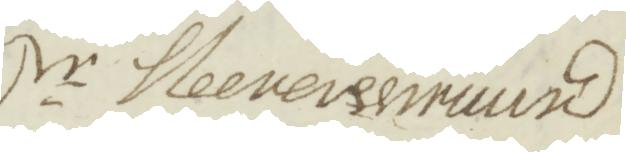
P=r Steevenswaard
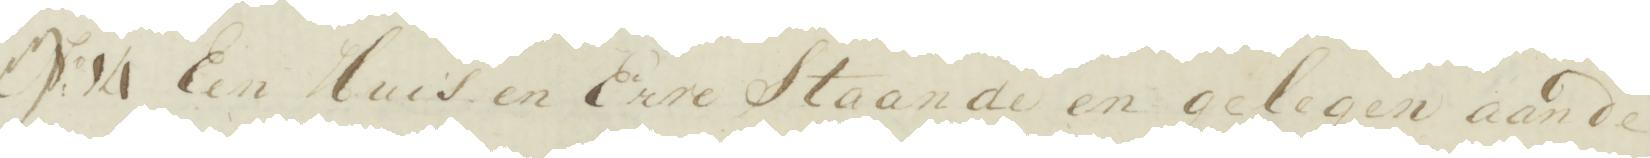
V:o 14 Een Huis en Erve staande en gelegen aan de
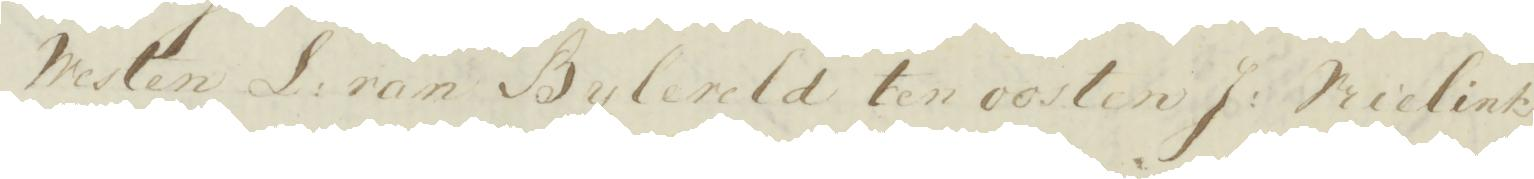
Westen L: van Byleveld ten oosten J: Vrielink
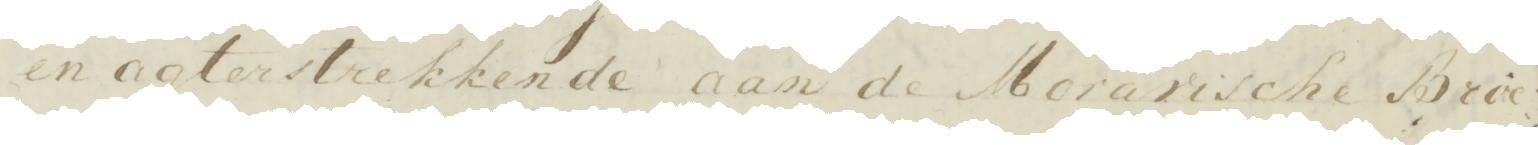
en agterstrekkende aan de Moravische Broe„
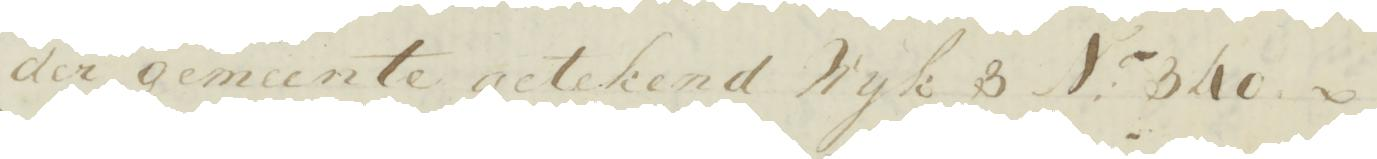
der gemeente getekend Wyk 3 N:o 340. —
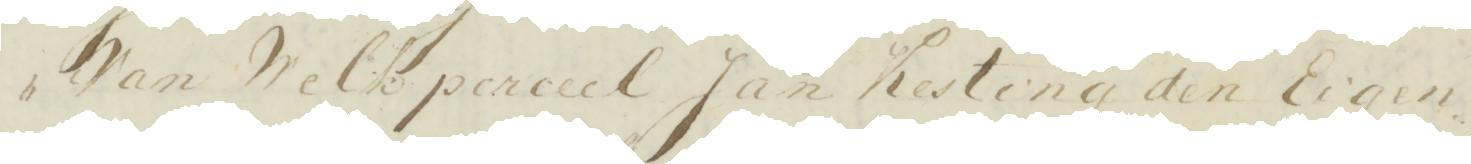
van Welk perceel Jan Kesting den Eigen„
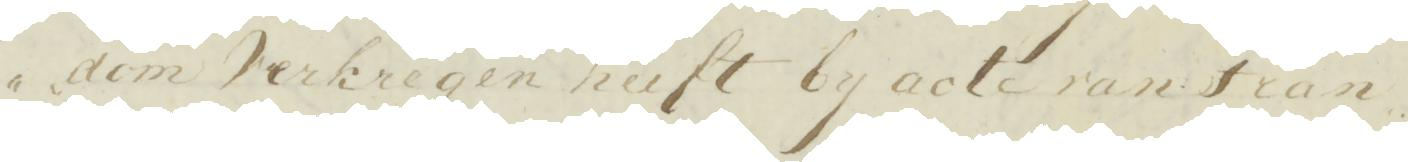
„dom verkregen heeft by acte van Tran
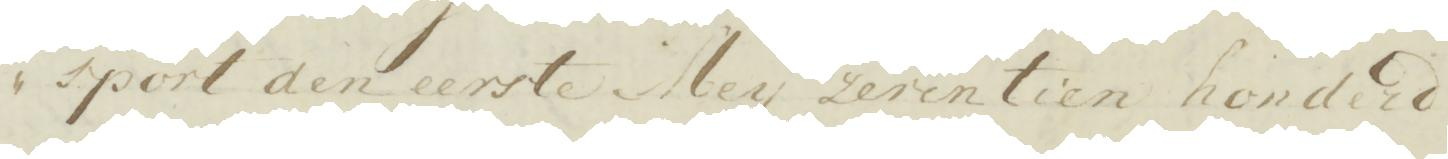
„sport den eerste Mey zeventien honderd
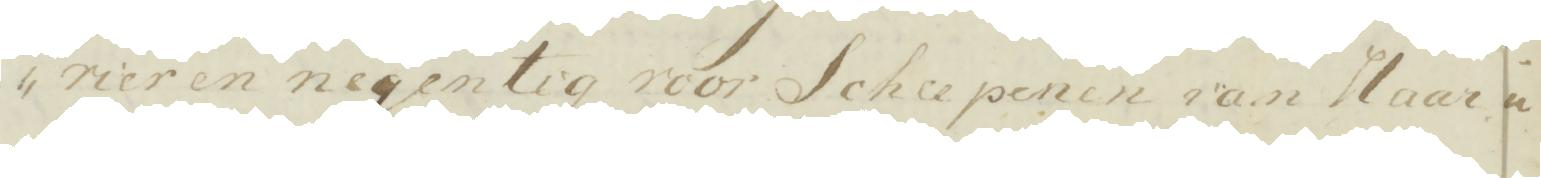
„vier en negentig voor scheepenen van Haar
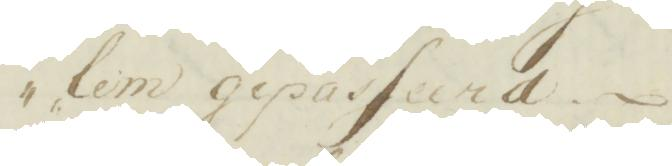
„lem gepasseerd.—
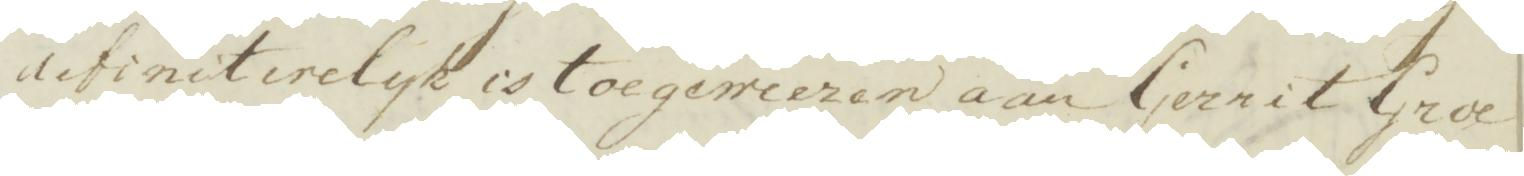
difinitivelyk is toegeweezen aan Gerrit Groe
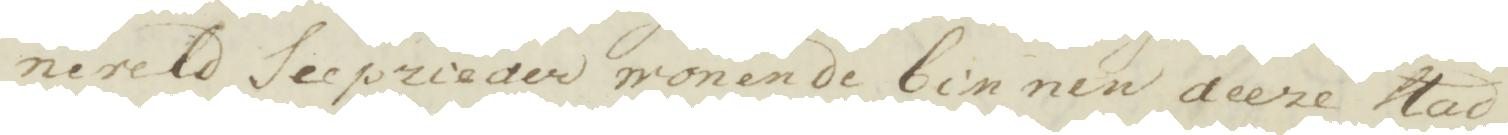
neveld seepzieder wonende binnen deeze stad
